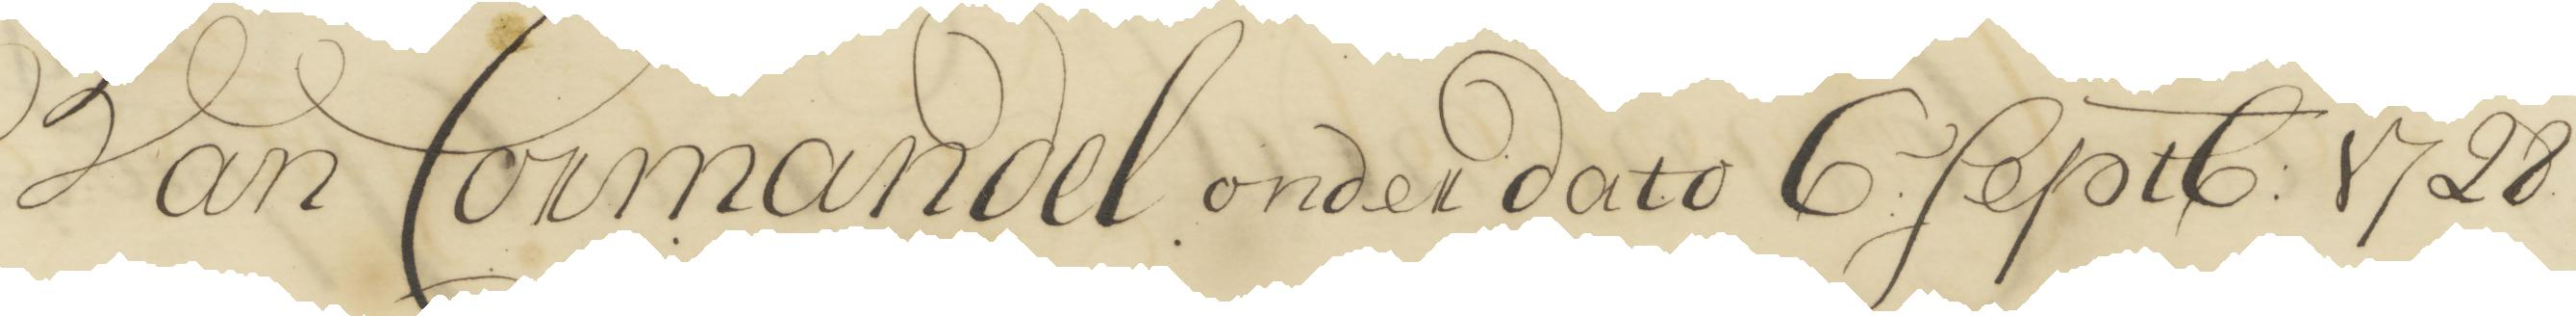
Van Cormandel onder dato 6:' septb: 1728
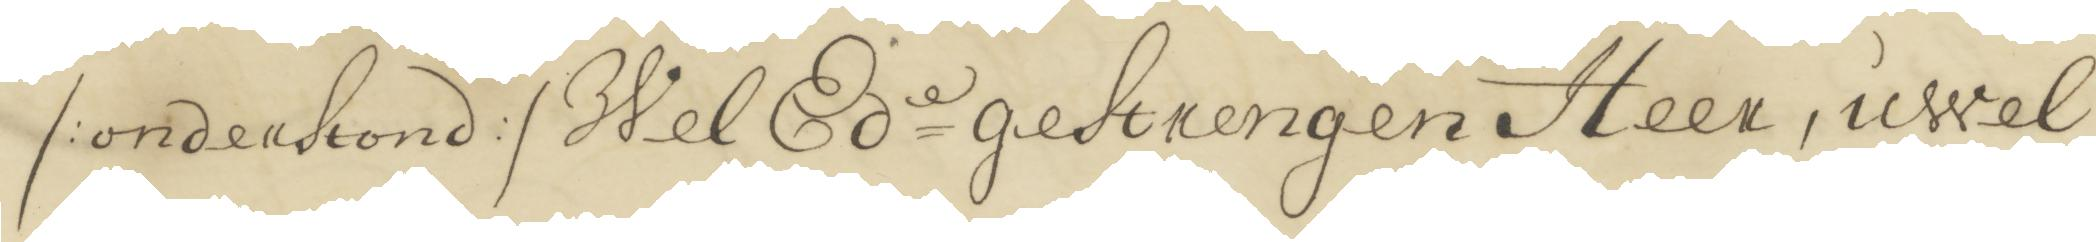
/:onderstond:/ Wel Ed=e gestrengen Heer, uwel
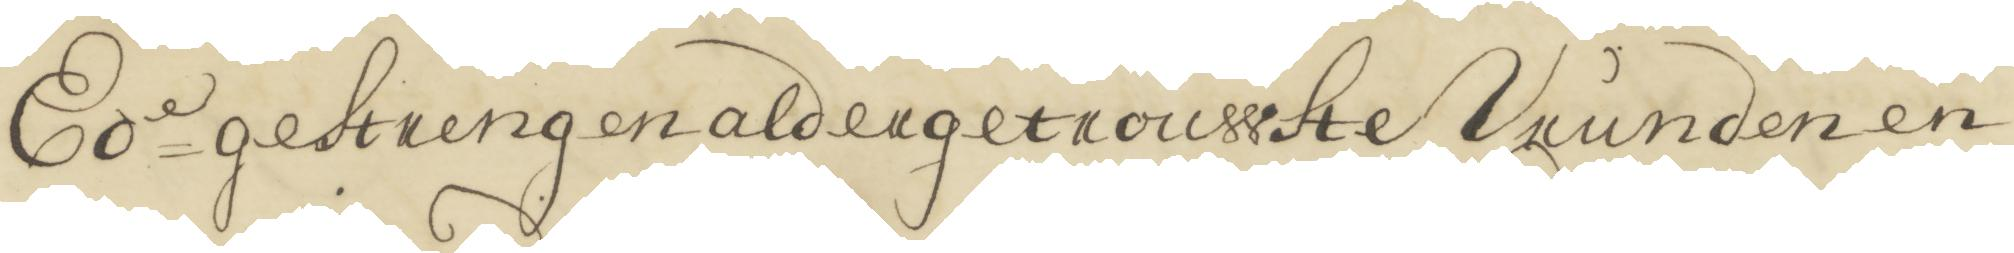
Ed=e gestrengen alder getrouwste Vrunden en
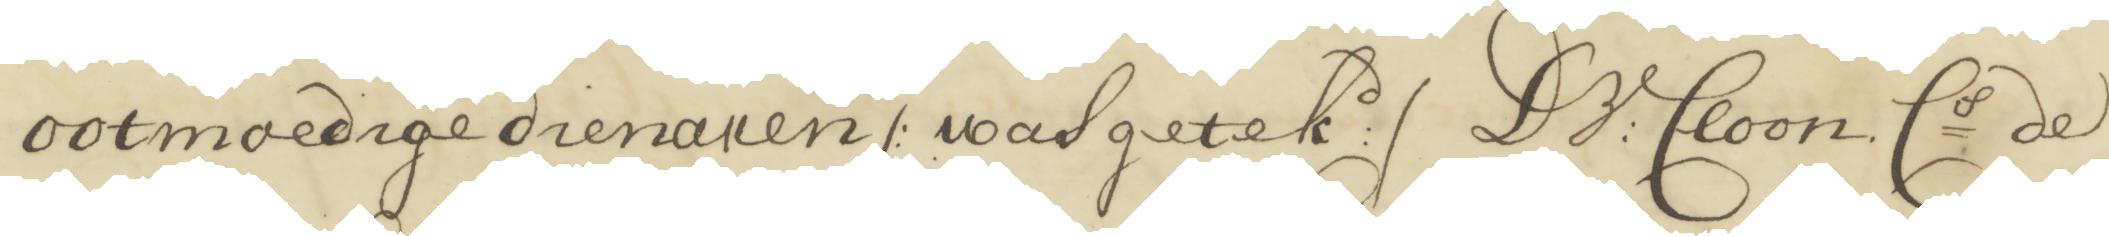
ootmoedige dienaren /:was getek:d / D V: Cloon C=s de
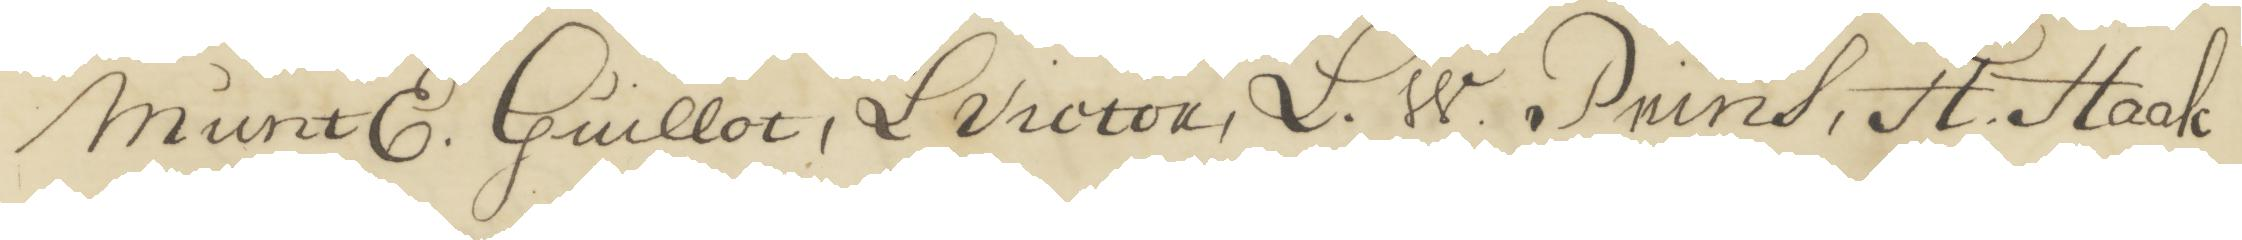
Munt E. Guillot, L Victor, L. W: Prins, H. Haak
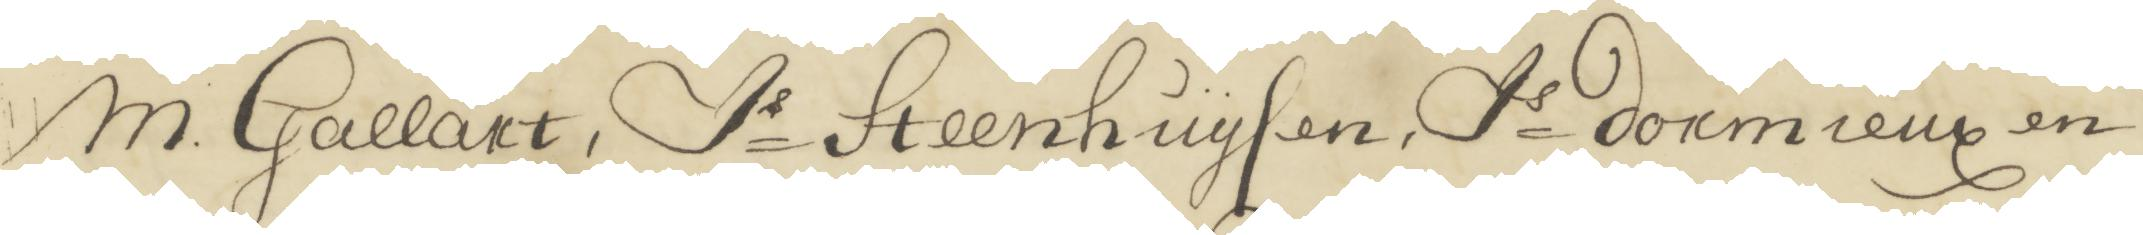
M. Gallart, I=s Steenhuijsen, I=s dormieux en
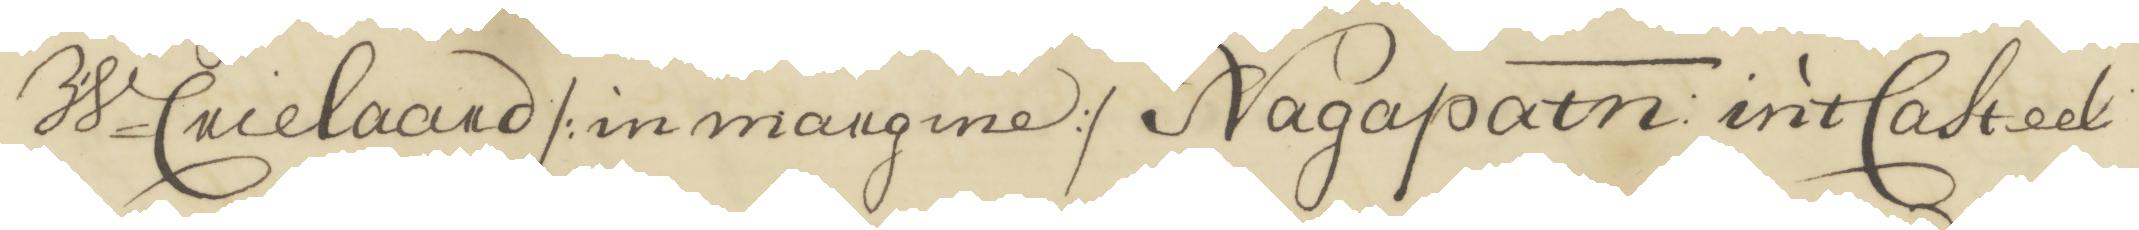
W= Crielaard /:in margine:/ Nagapatn: in ’t Casteel
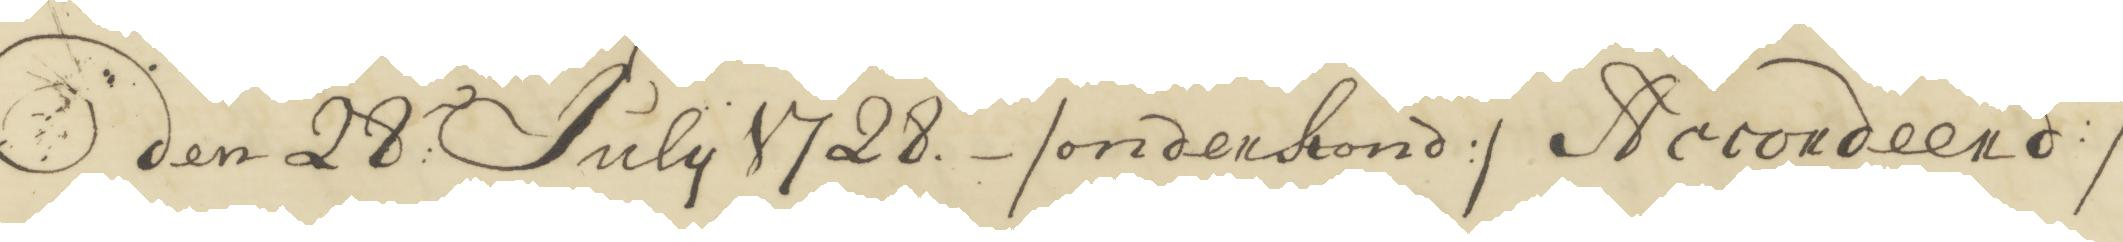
den 28:' Iulij 1728.- /onderstond:/ Accordeerd:/
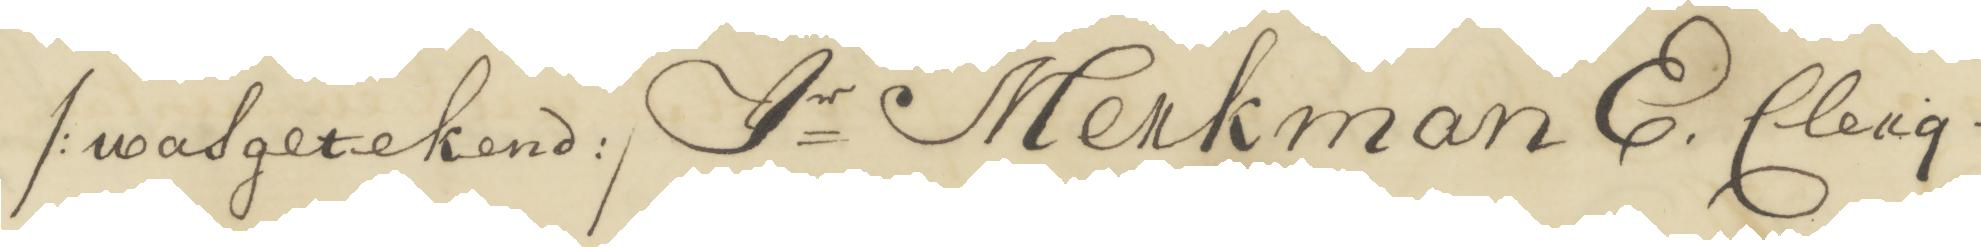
/:was getekend :/ I=r Merkman E: Clerq
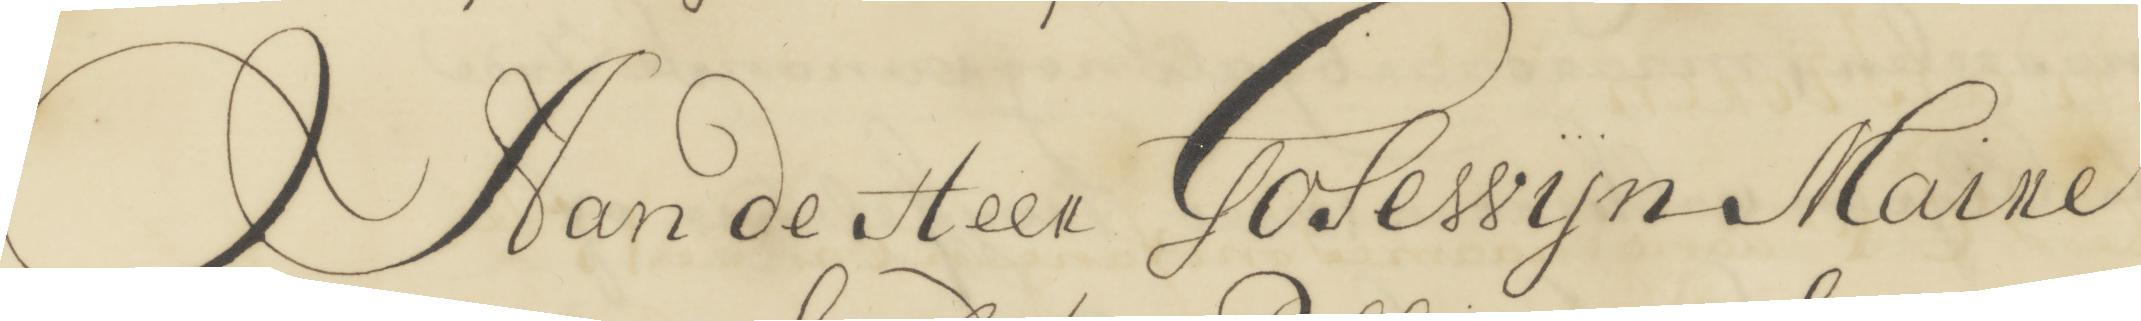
Aan de Heer Gosewijn Maire
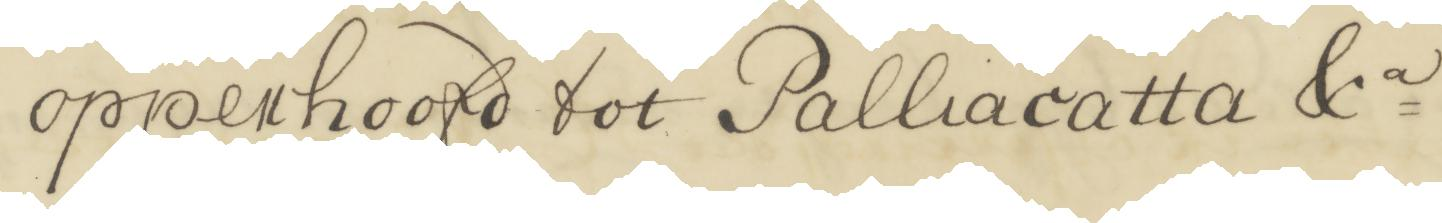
opperhoofd tot Palliacatta &=a
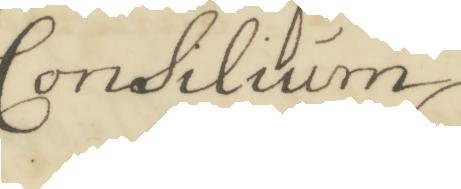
Consilium
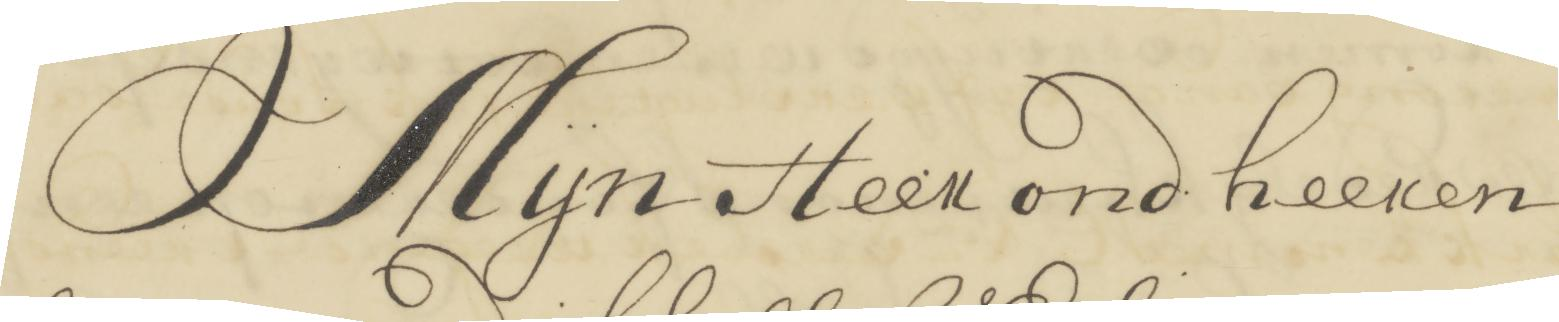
Mijn Heer ond heeren
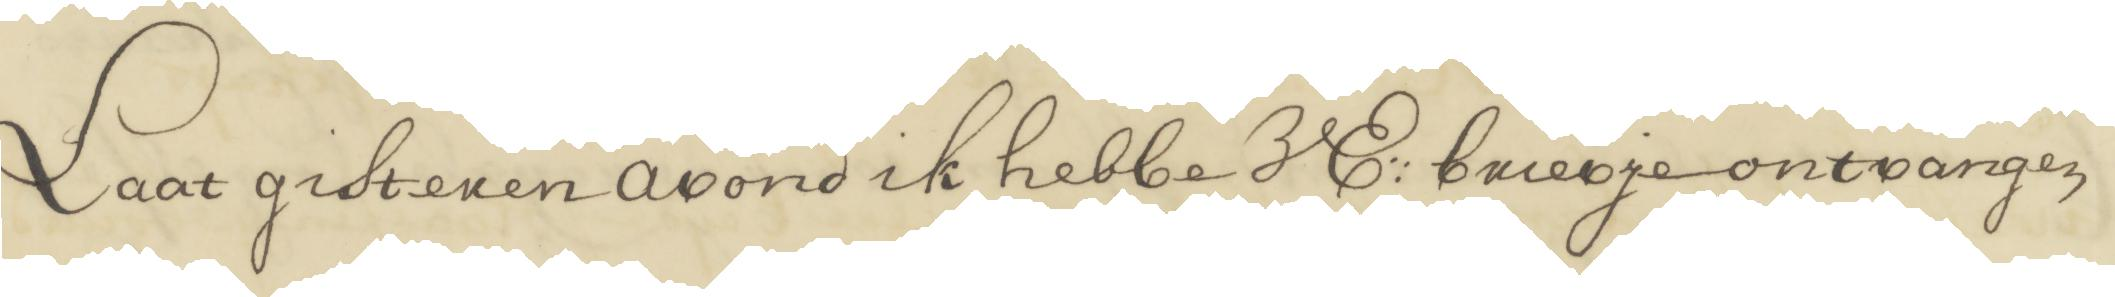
Laat gisteren avond ik hebbe VE: brievje ontvangen
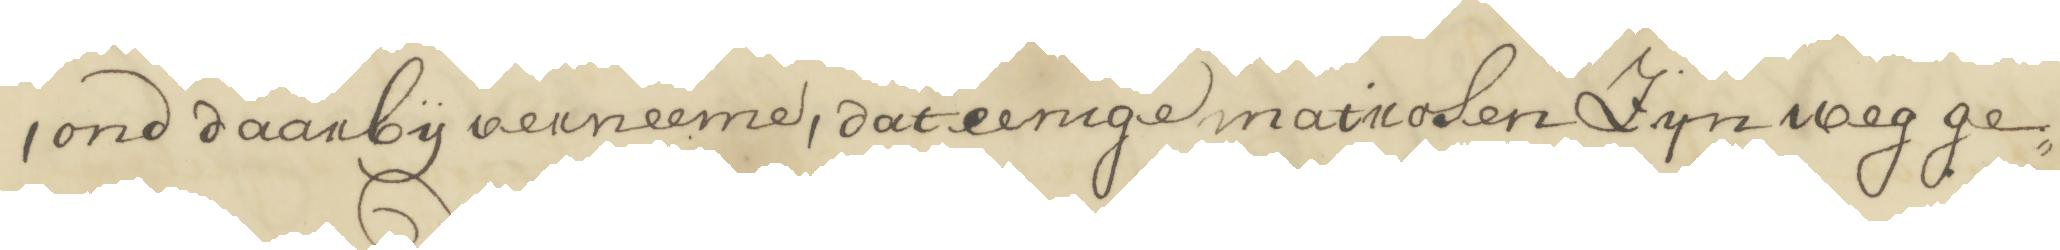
, ond daar bij verneeme, dat eenige matrosen Zijn weg ge„
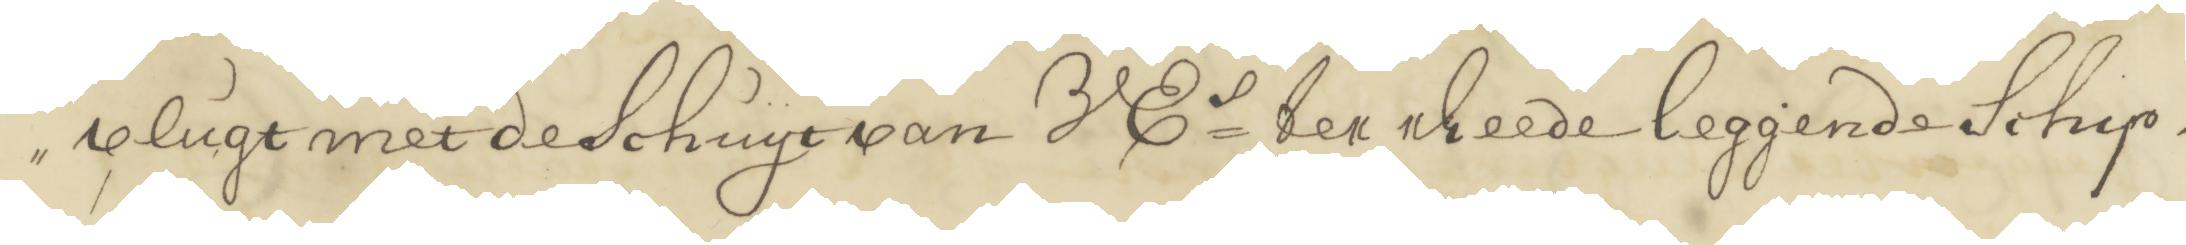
„vlugt met de Schuijt van VE=s ter rheede leggende Schip
